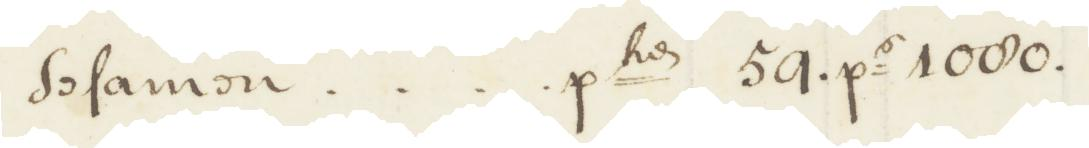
te samen . . . . p=ken 54. p=s 1080.
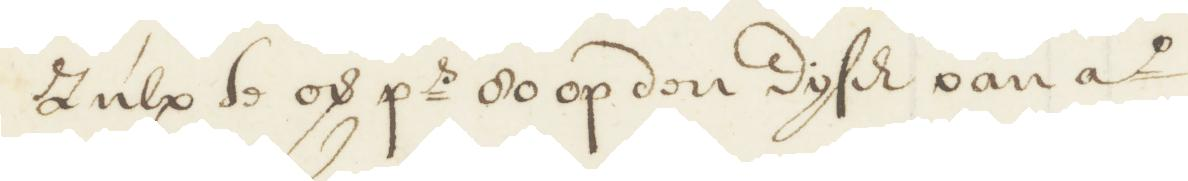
zulx te over p=s 80 op den Eijsch van a=o
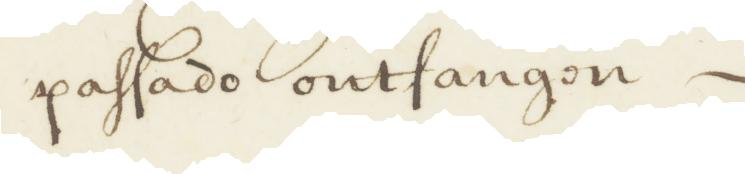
passado ontfangen —
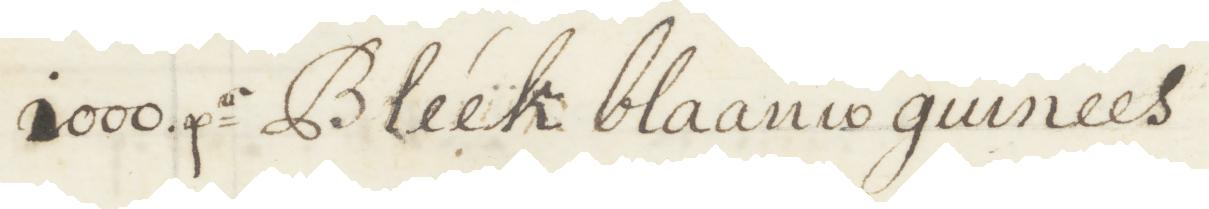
1000. p=s Bleek blaauw guinees
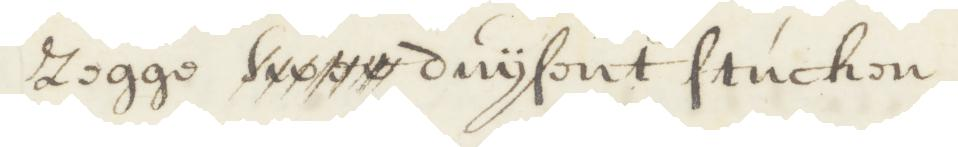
zegge twee duijsent stucken
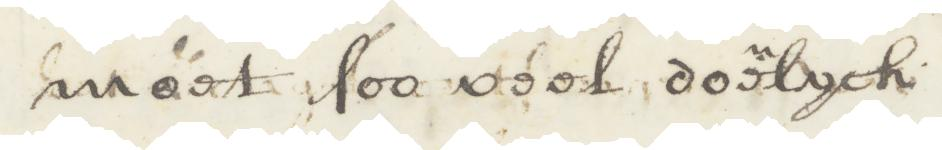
maet soo veel doenlyck
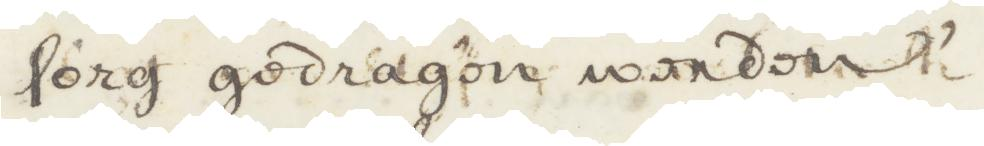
sorg gedragen werden '
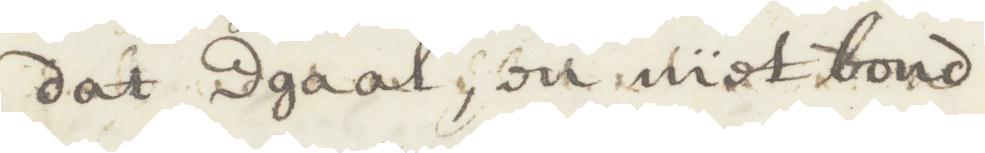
dat Egaal; en niet bond
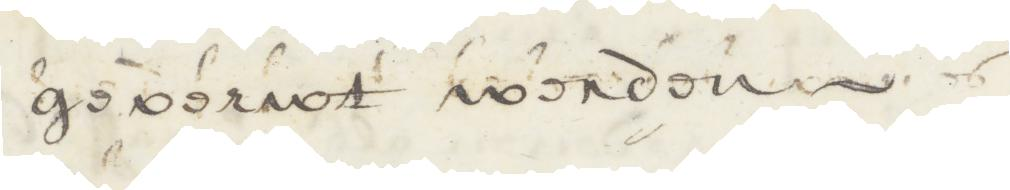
geverwt werden
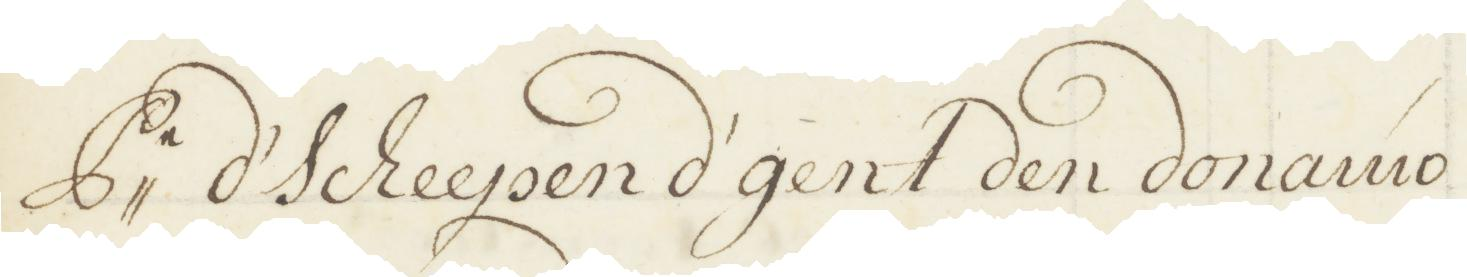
P„r d’scheepen d’ gent den donauw
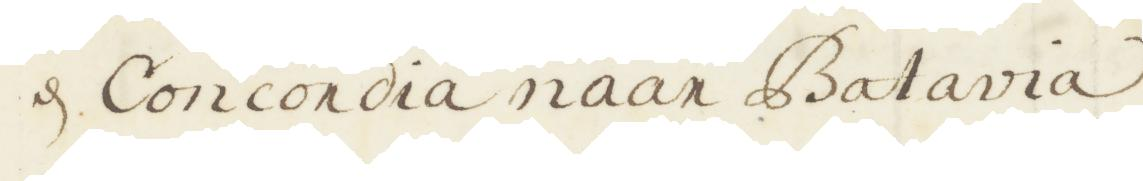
en Concordia naar Batavia
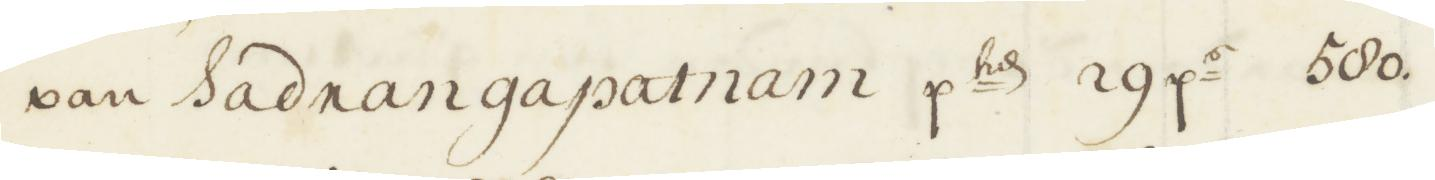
van Sadrangapatnam p=ken 29 p=s 580.
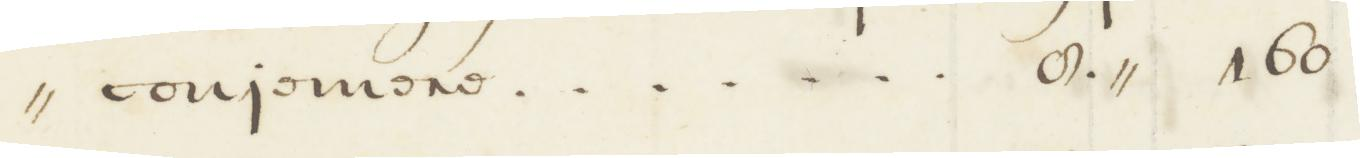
„ conjemere - - - - - - - 8.„ 160
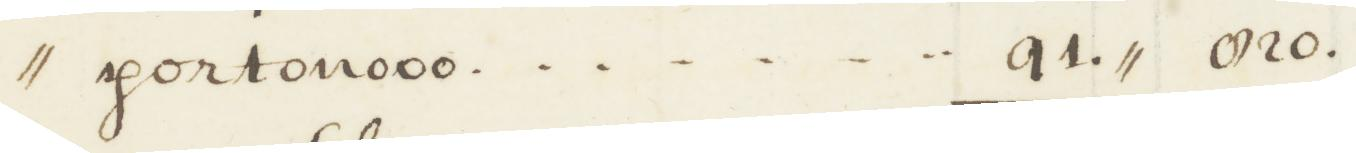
„ portonovo - - - - - - - - 41.„ 820.
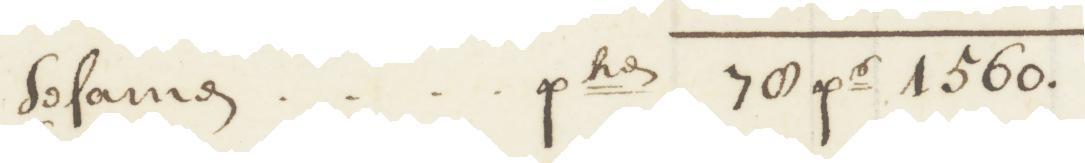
te samen - - - - p=ken 78 p=s 1560.
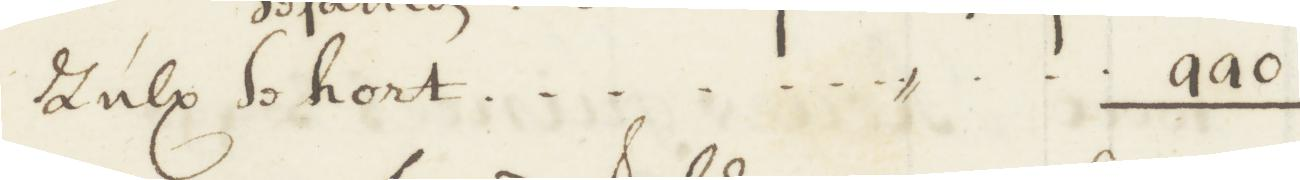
zulx te kort - - - - - - - „ - - - 440
